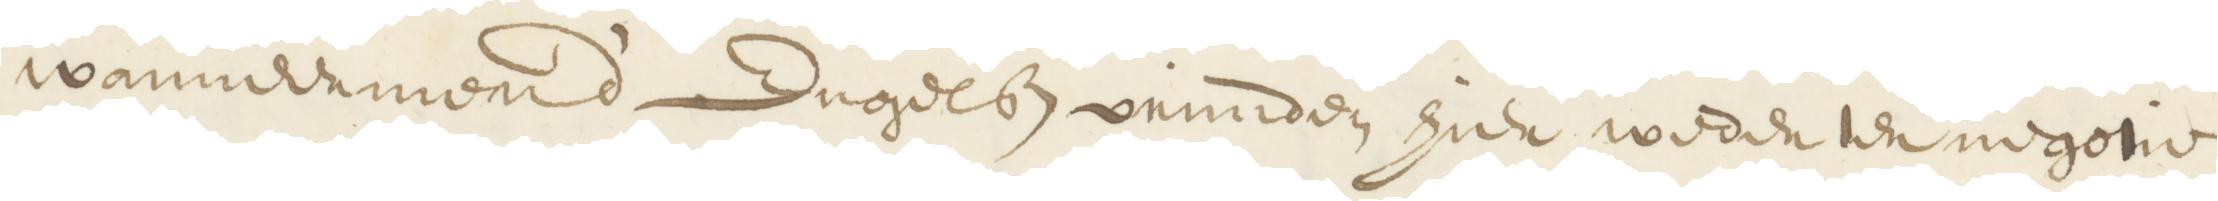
wanneer men d' Engelsz vrunden hier weder ter negotie
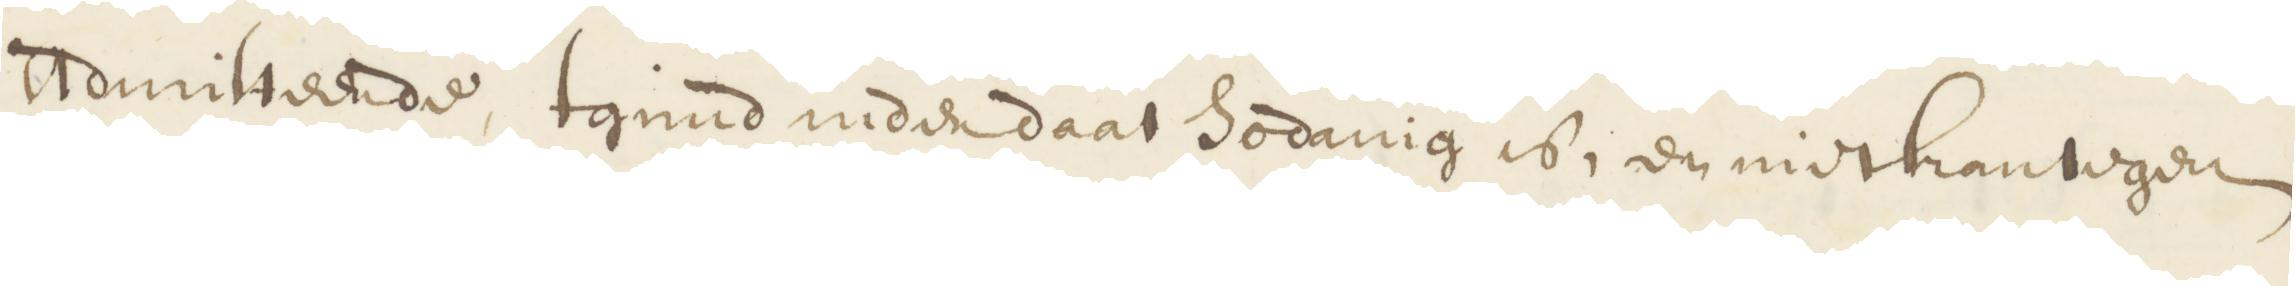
admitteerde, tgund inderdaat sodanig is, en niet kantegen
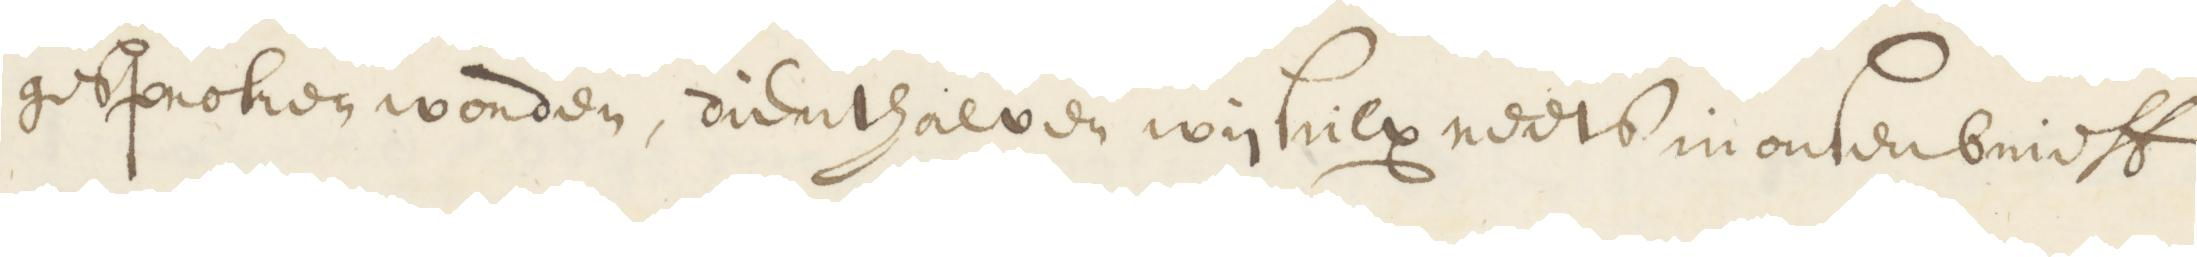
gesproken worden, dienthalven wij sulx reets in onsen brieff
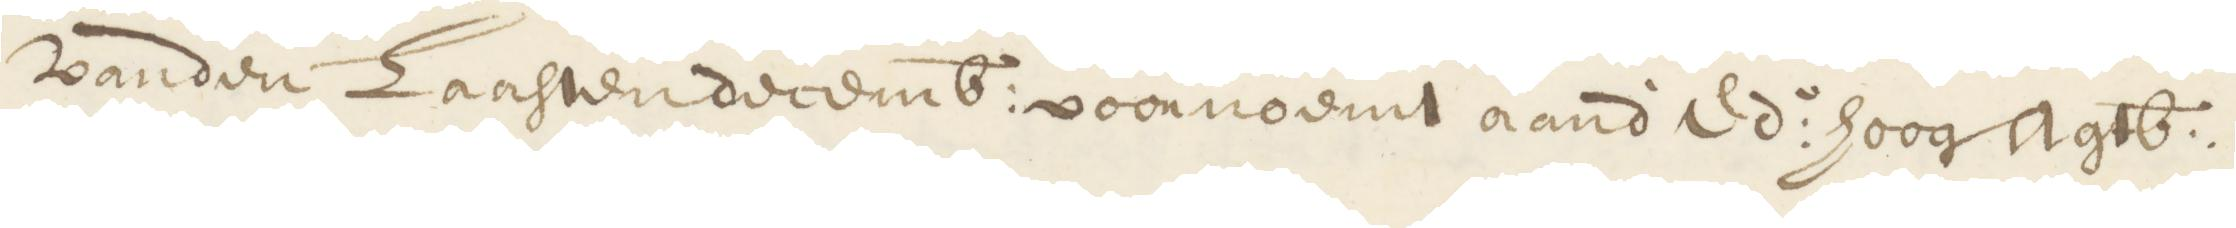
vanden laasten decemb: voornoemt aan d’ Ed:e hoog agtb:
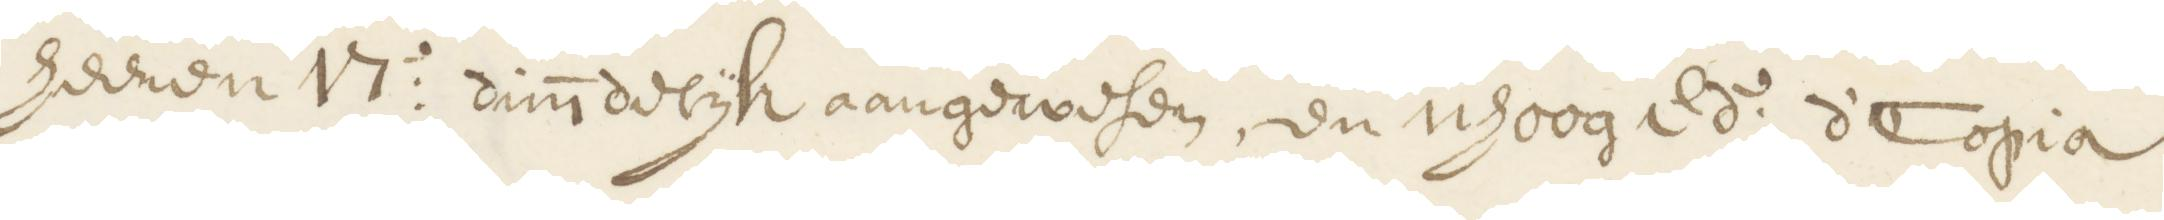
heeren 17:' duijdelijk aangewesen, en uhoog Ed:e d’Copia
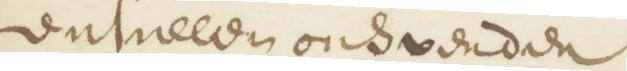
en sullen ons verder
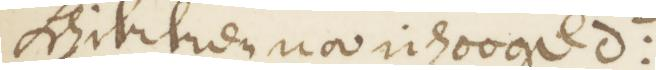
schikken na u hoog Ed:e
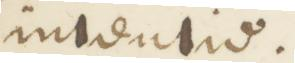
intentie.
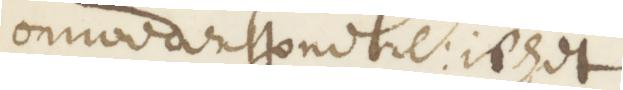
onwederspreklijk is het
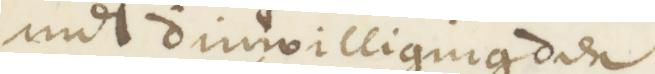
met d'inwilliging der
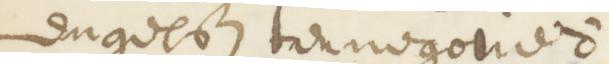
Engelsz ter negotie d'
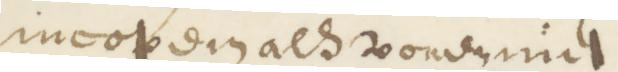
incopen als voren niet
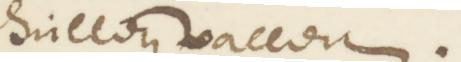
sullen vallen.
